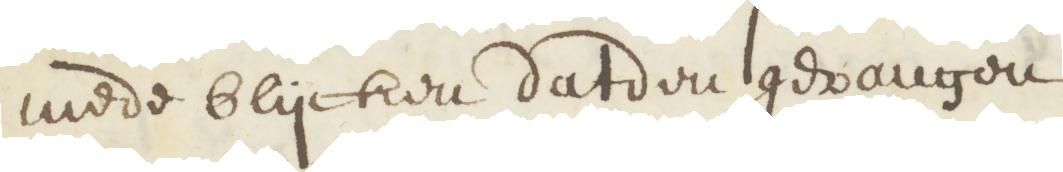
mede blijcken dat den gevangen
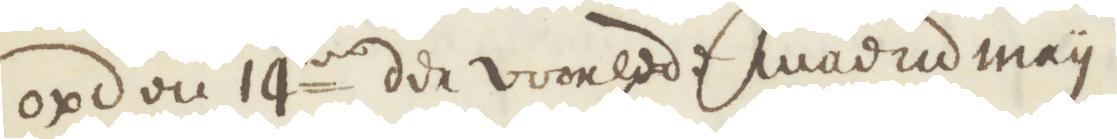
op den 14=en der voorlede maend maij
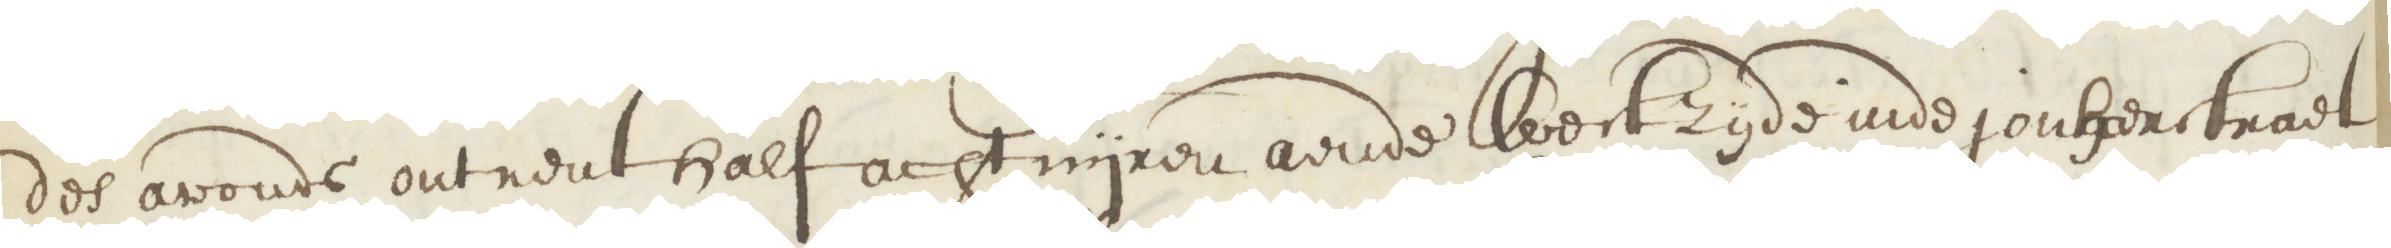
des avonds ontrent half acht uijren aende kert zijde inde jonkerstraet
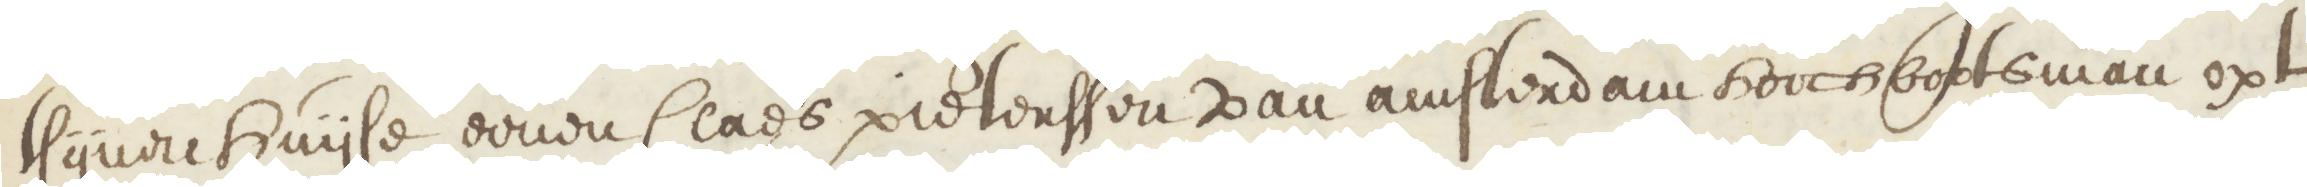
tsijnen huijse eenen Claes pieterssen van amsterdam hooch bootsman op t
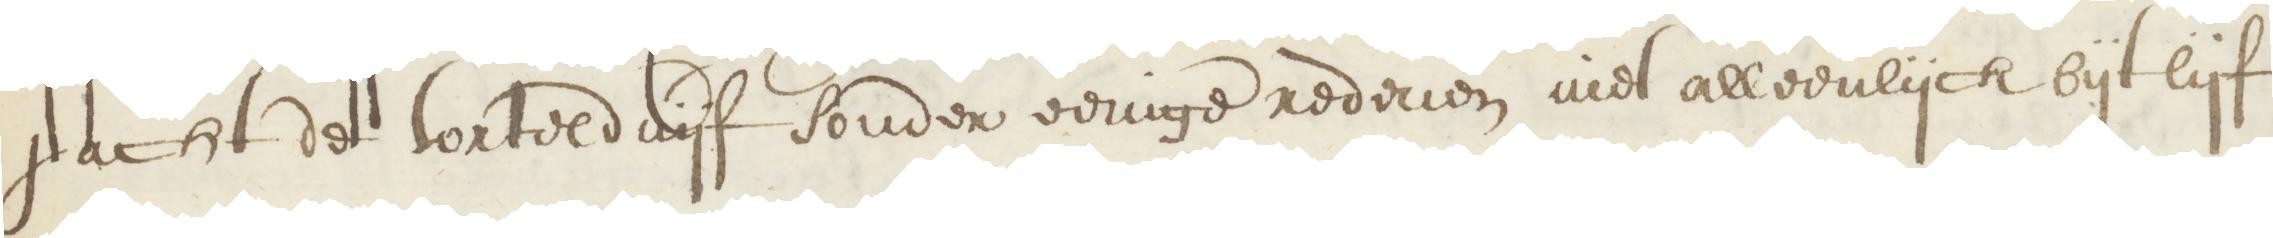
jacht de tortelduijf sonder eenige redenen niet alleenlijck bijt lijf
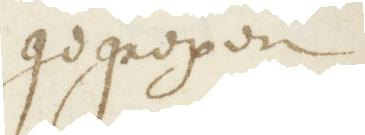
gegrepen
